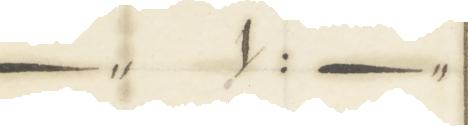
—„ 1: —„
